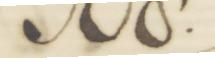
308.
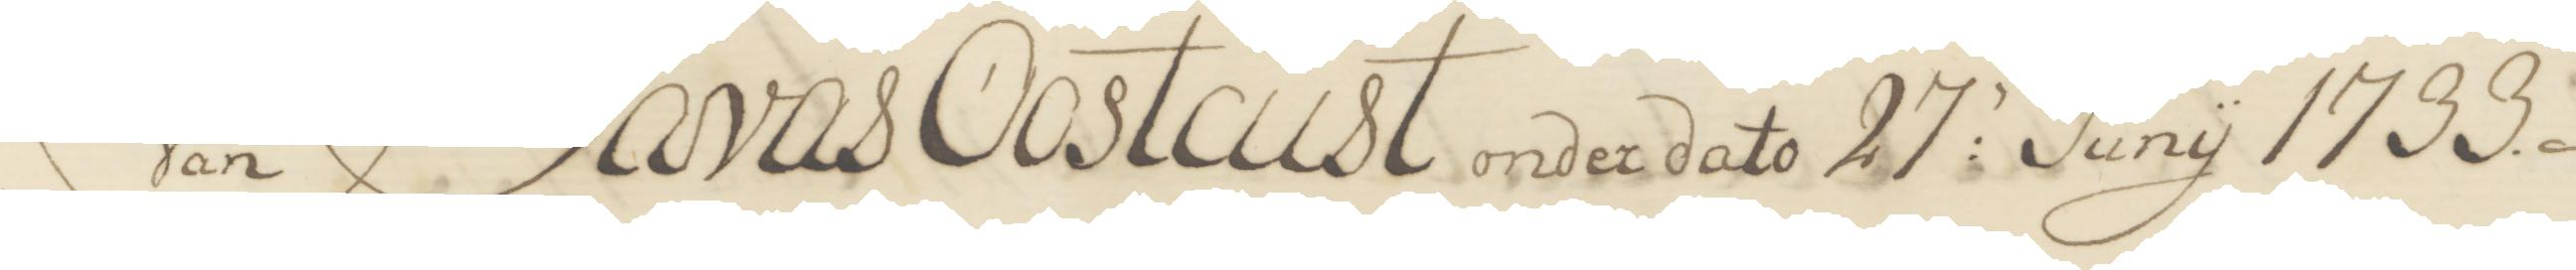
Van Javas Oostcust onder dato 27:' Iunij 1733.-
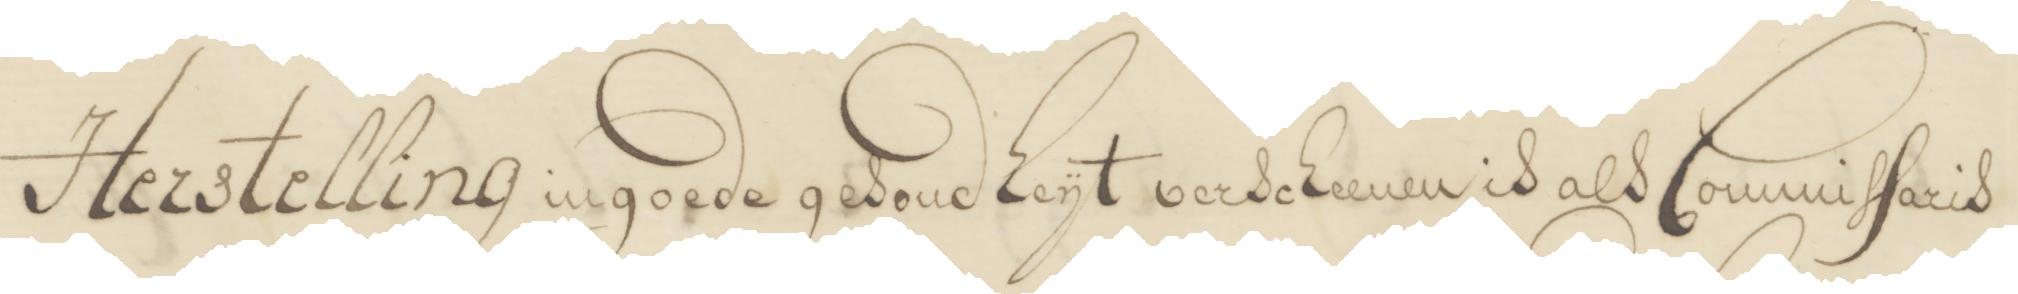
Herstelling in goede gesondheijt verscheenen is als Commissaris
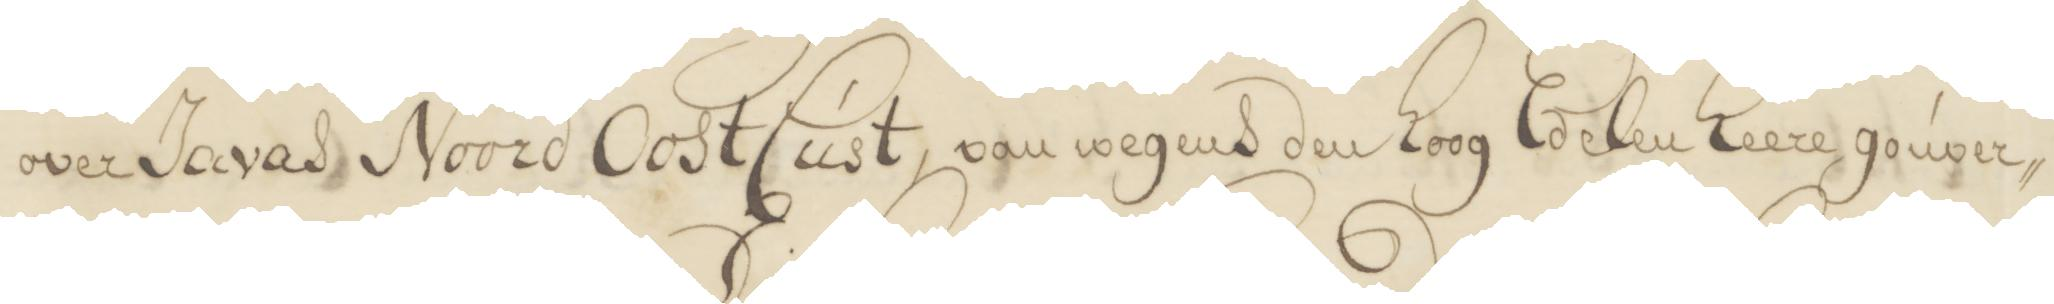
over Javas Noord Oost Cust, van wegens den hoog Edelen heere gouver„
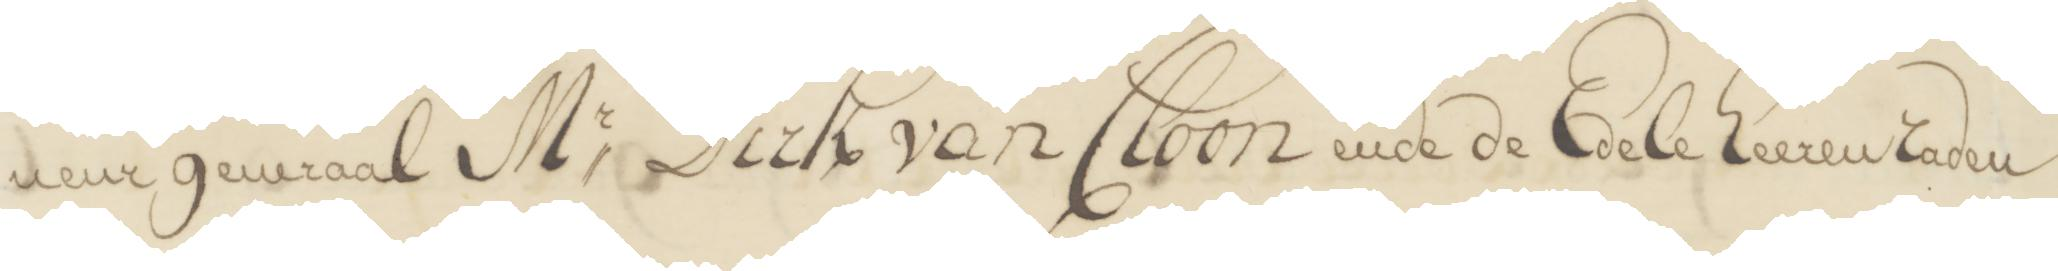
neur generaal M„r Dirk van Cloon ende de Edele heeren raden
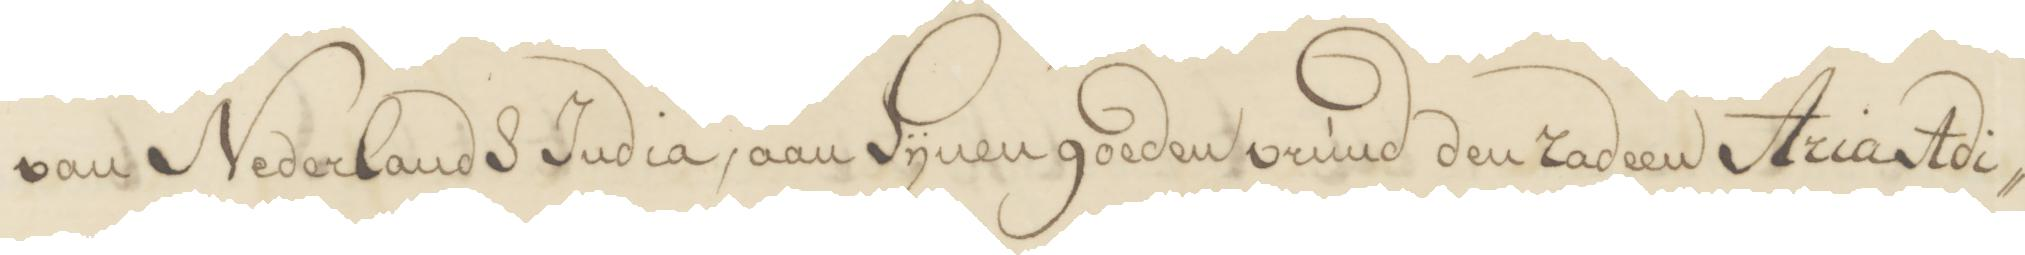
van Nederlands India, aan sijnen goeden vrund den radeen Aria Adi„
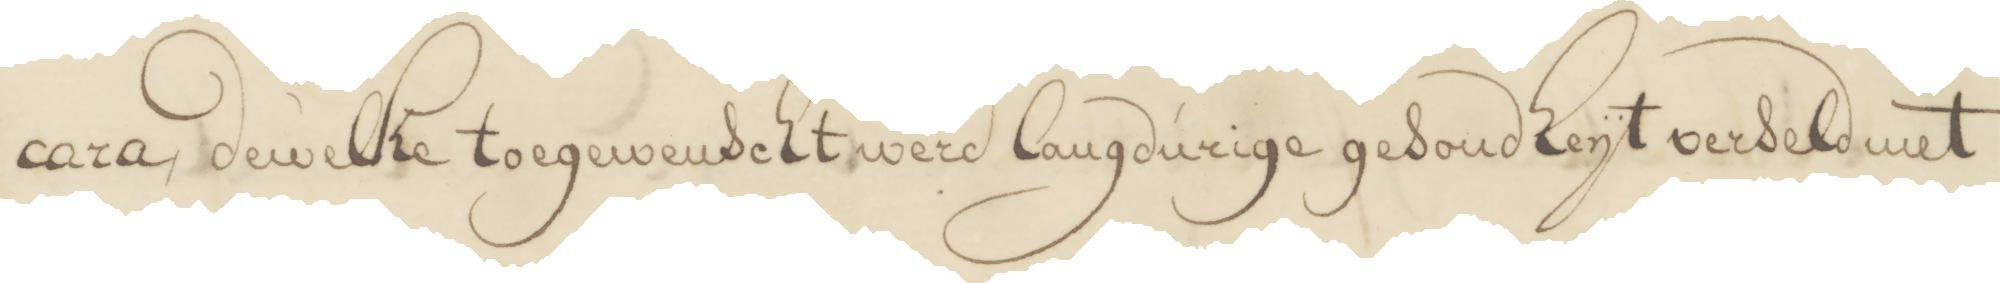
cara, dewelke toegewenscht werd langdurige gesondheijt verseld met
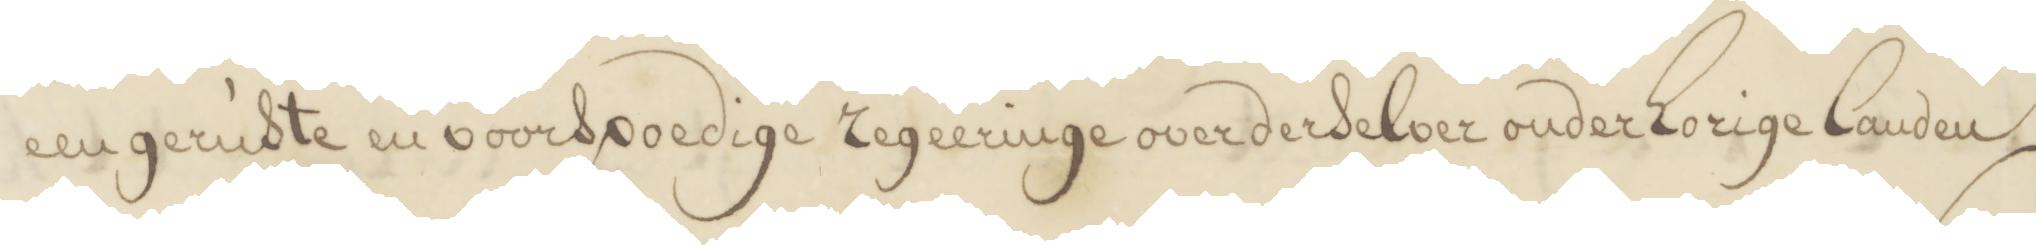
een geruste en voorspoedige regeeringe over derselver onderhorige landen
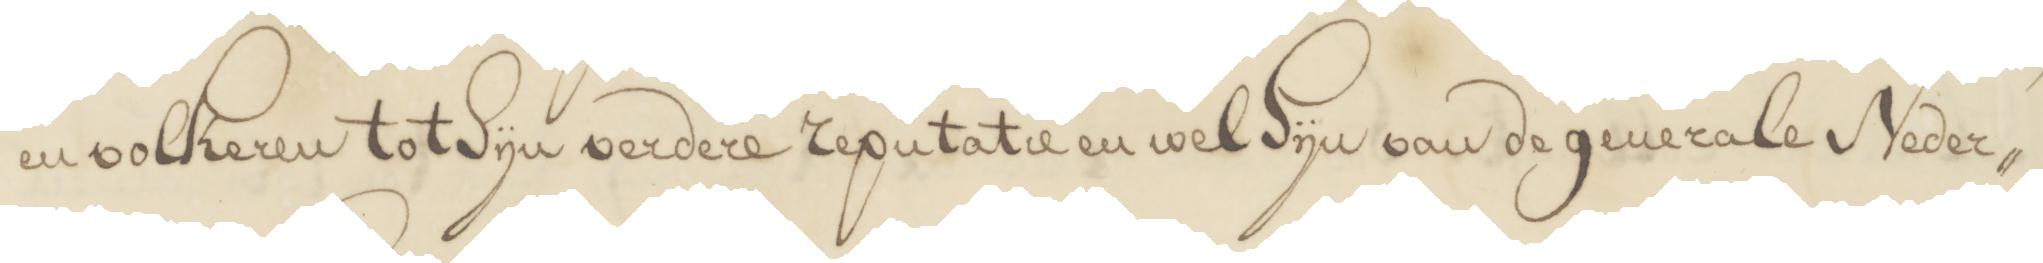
en volkeren tot sijn verdere reputatie en welsijn van de generale Neder„
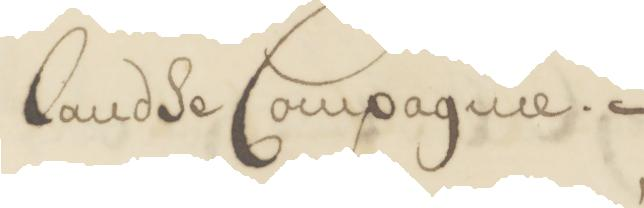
landse Compagnie. -
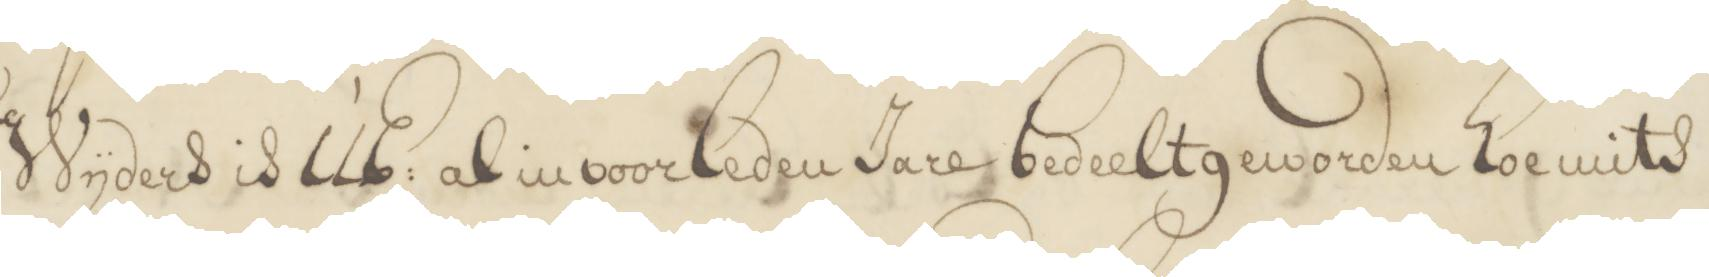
Wijders is UE: al in voorleden Iare bedeelt geworden hoe mits
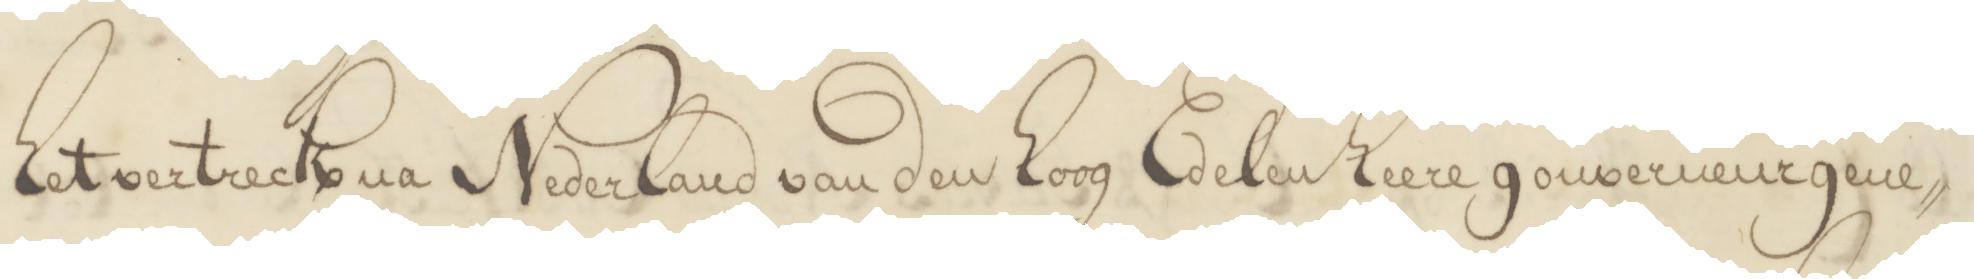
het vertreck na Nederland van den hoog Edelen heere gouverneur gene„
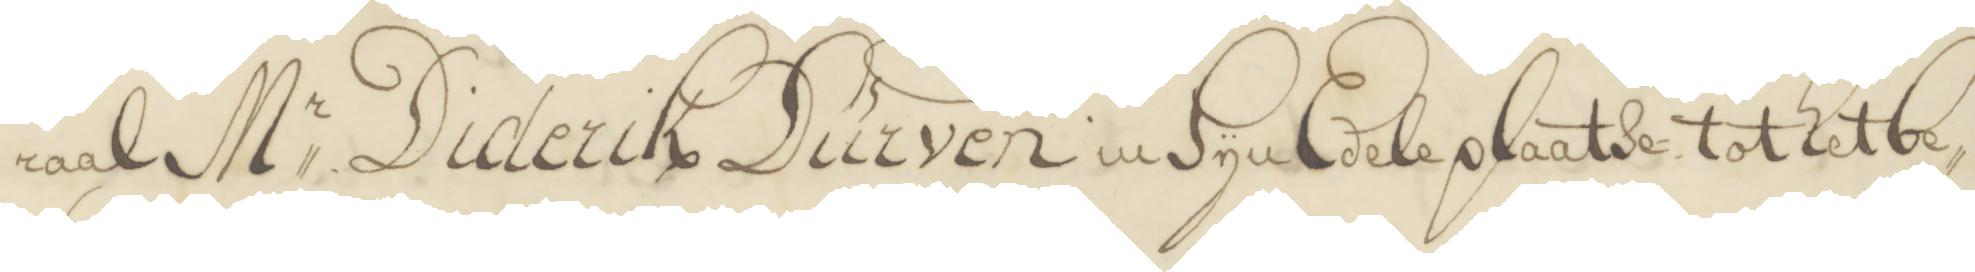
raal M„r Diderik Durven in sijn Edele plaatse tot het be„
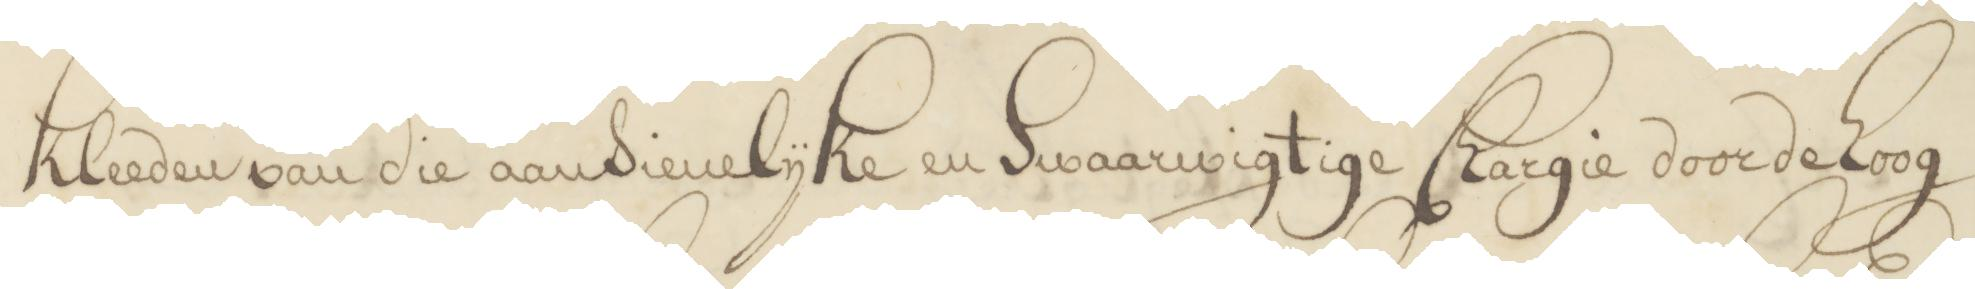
kleeden van die aansienelijke en swaarwigtige Chargie door de hoog
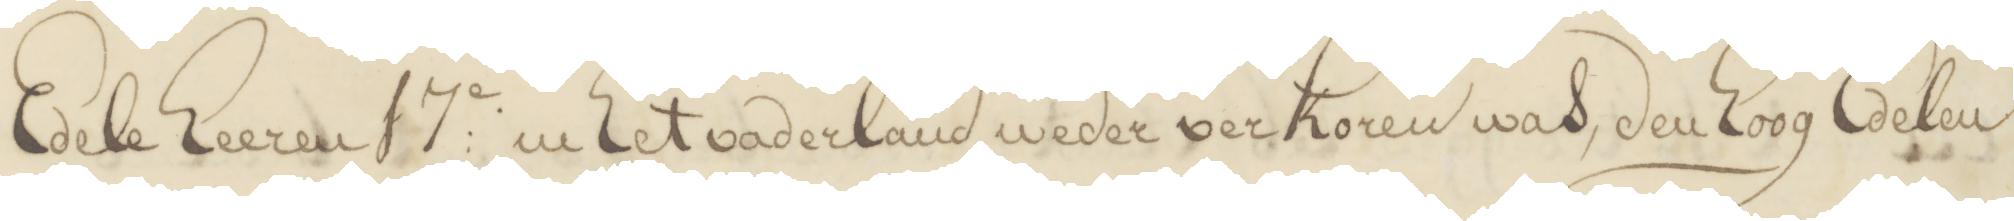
Edele heeren 17:e in het vaderland weder verkoren was, den hoog Edelen
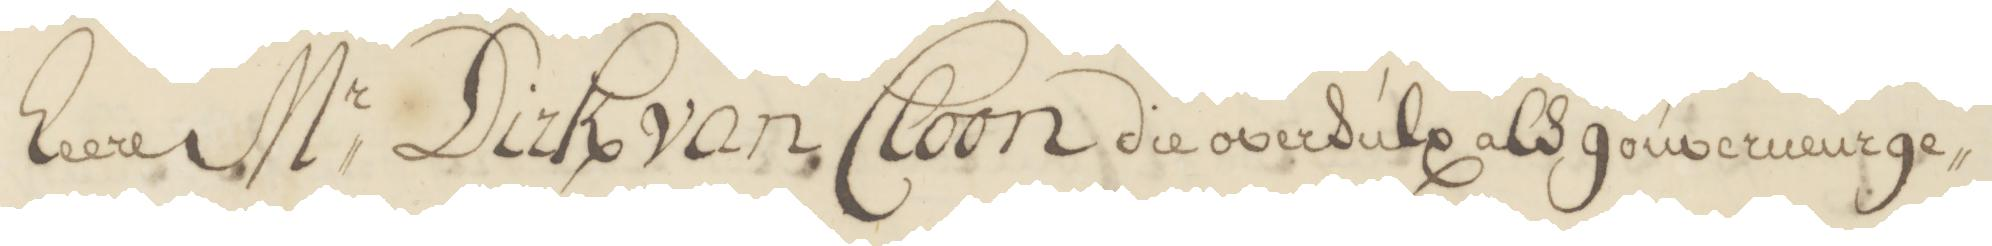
heere M„r Dirk van Cloon die oversulx als gouverneur ge„
